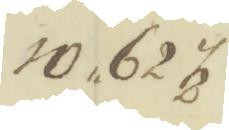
10„62½
